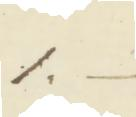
1. —
